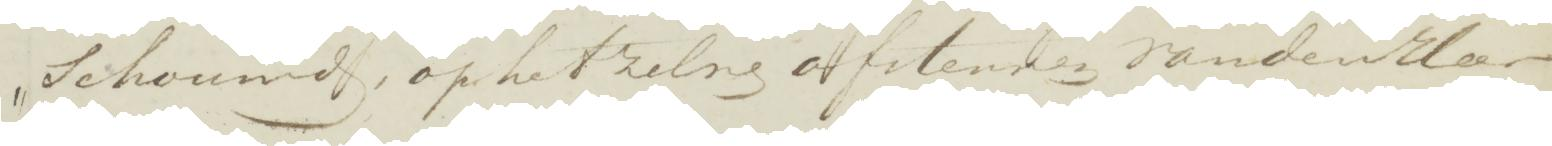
„schouwd, op hetzelve afsterven van den Heer
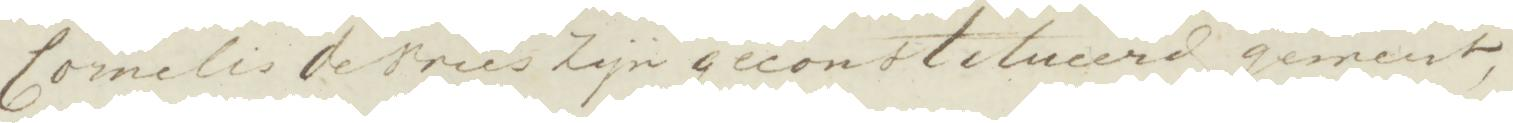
Cornelis de Vries zijn geconstitueerd geweest,
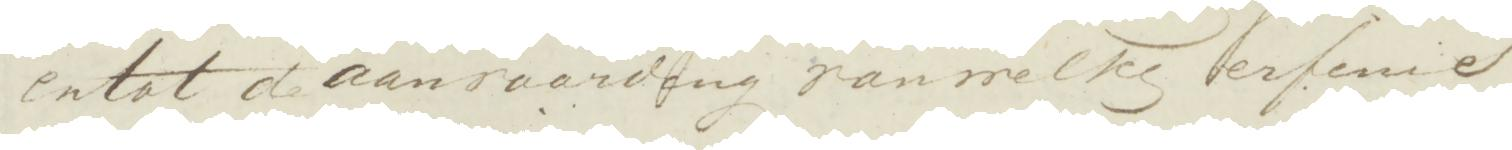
en tot de aanvaarding van welke erfenis
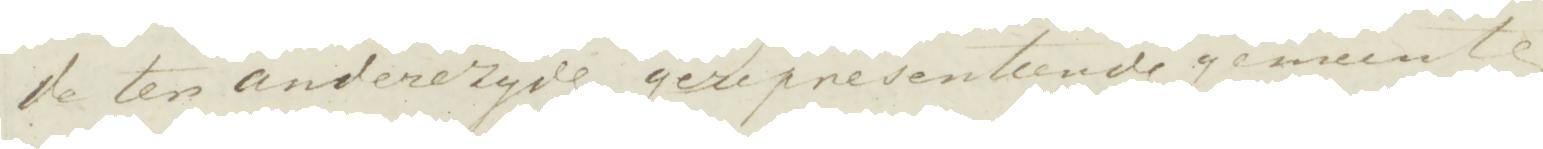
de ter andere zijde gerepresenteerde gemeente
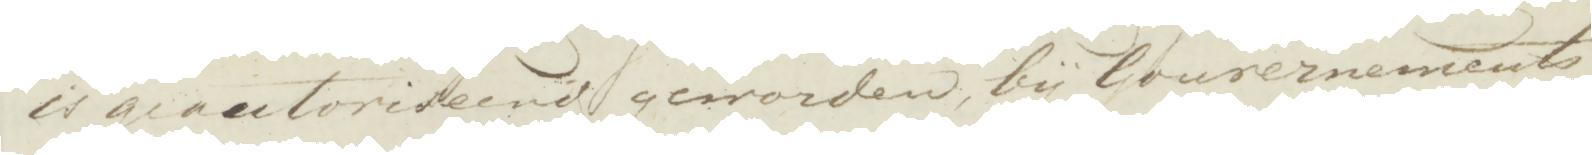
is geautoriseerd geworden, bij Gouvernements
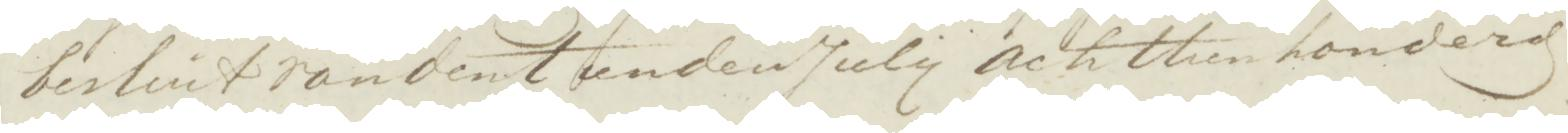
besluit van den tienden Julij achttien honderd
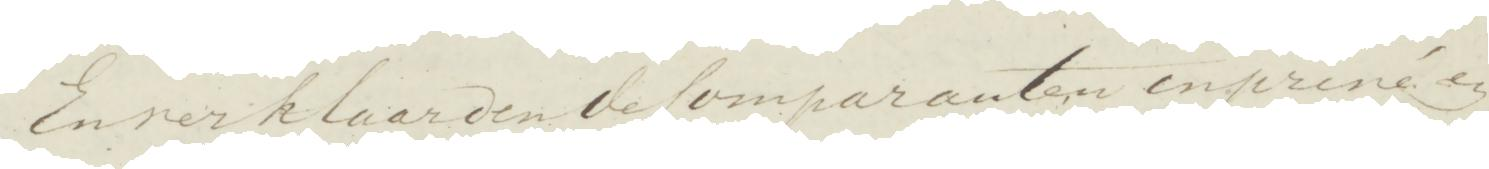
En verklaarden de Comparanten in privé en
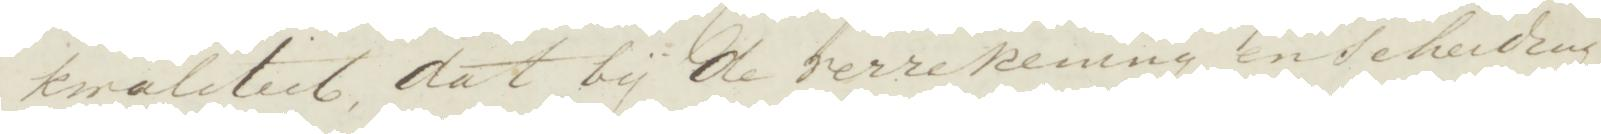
kwaliteit, dat bij de verrekening en scheiding
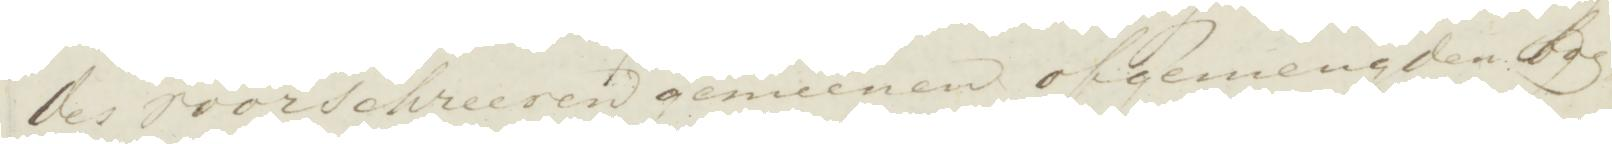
des voorschreeven gemeenen of gemengden boe
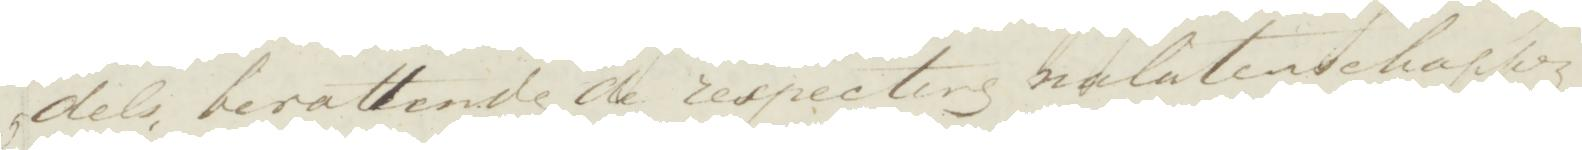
„dels, bevattende de respective nalatenschappen
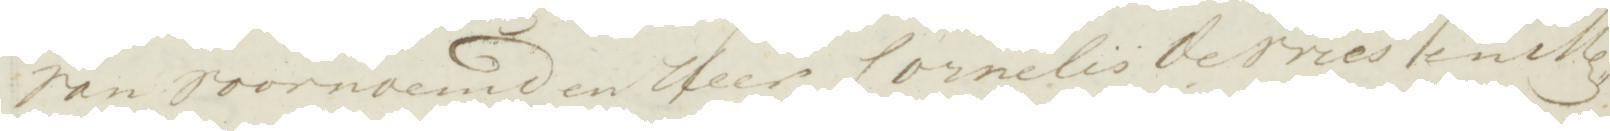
van voornoemden Heer Cornelis de vries en Me
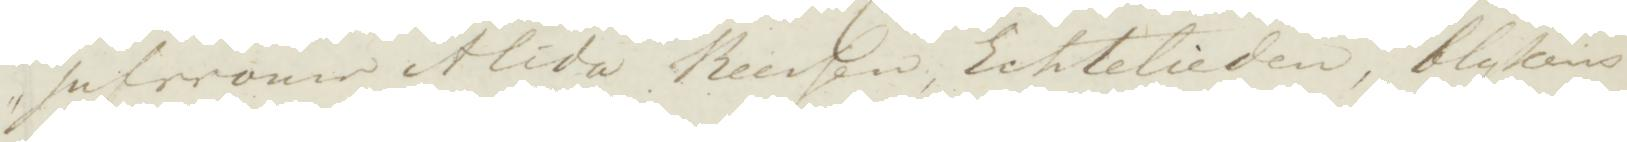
„jufvrouw Alida Reessen, Echtelieden, blykens
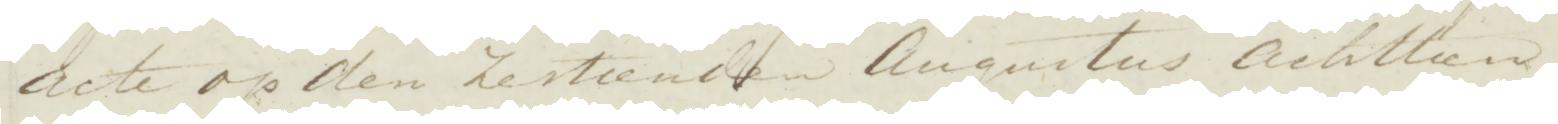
acte op den zestienden Augustus achttien
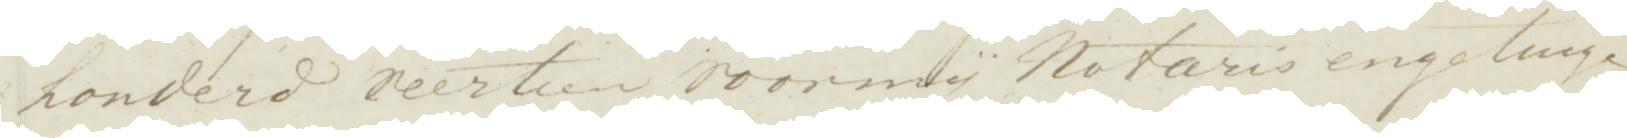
honderd veertien voor mij Notaris en getuigen
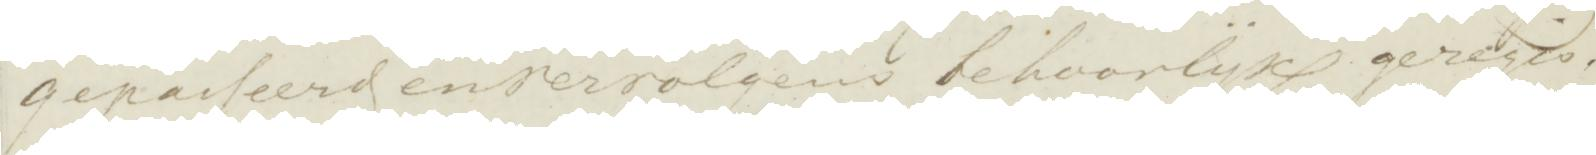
gepasseerd en vervolgens behoorlijk geregis
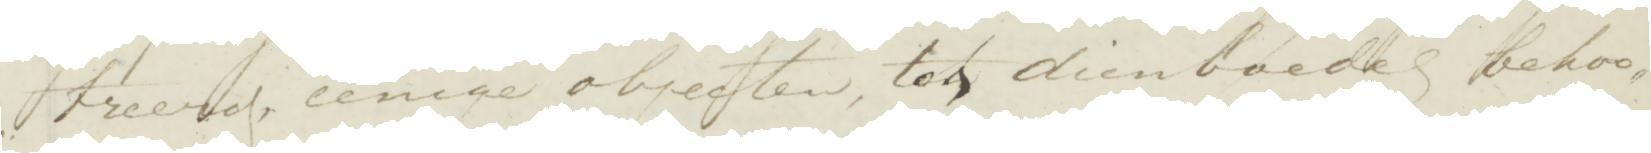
treerd, eenige objecten, tot dien boedel behoo„
